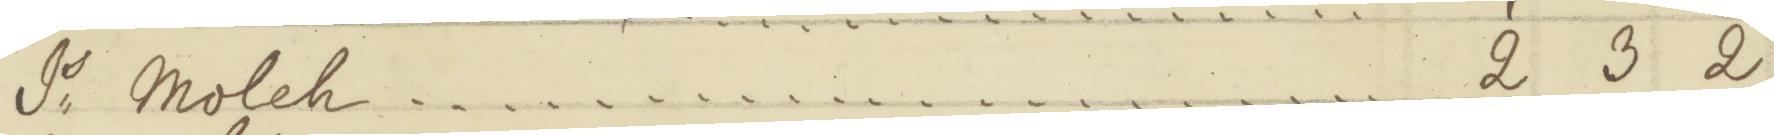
I„s Moleh . . . . . . . . . . . . . . . . . . . . . 2 3 2
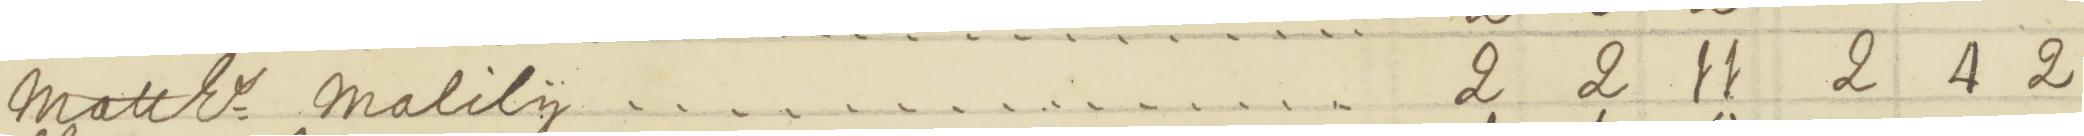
Matth=s malilij . . . . . . . . . . . . . . . 2 2 11 2 4 2
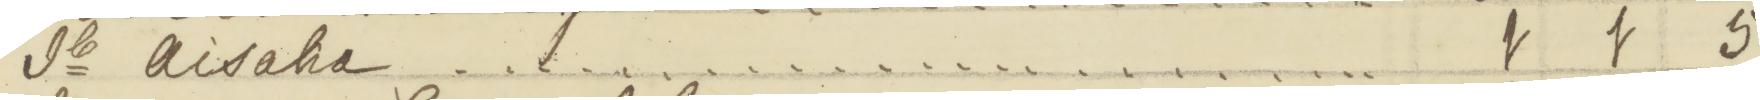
I=b aisalia . . . . . . . . . . . . . . . . . . . . . . . . . 1 1 5
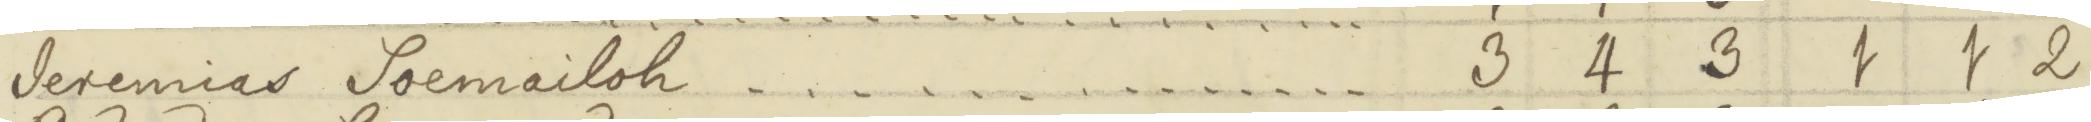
Ieremias Soemailoh - . - . . - . . . . . . . . 3 4 3 1 1 2
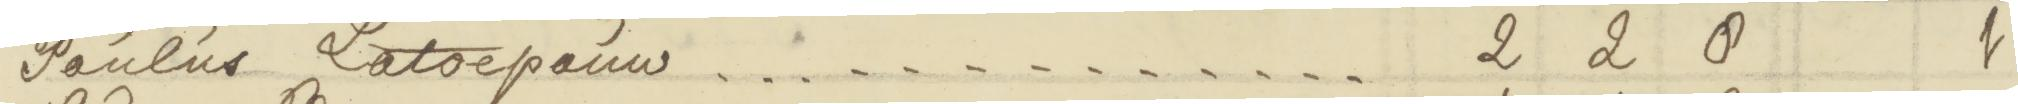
Paulus Latoepauw . . . - - - - - - - - - - 2 2 8 1
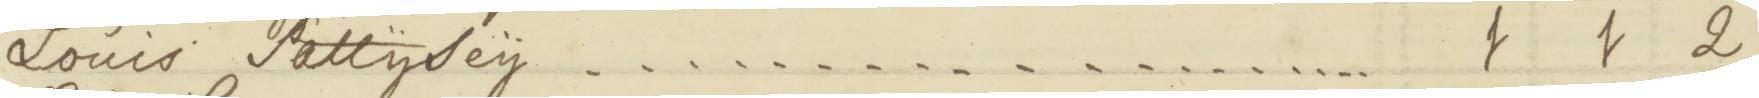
Louis Pattijseij . . . . . - - - - - - - - - - - - - - 1 1 2
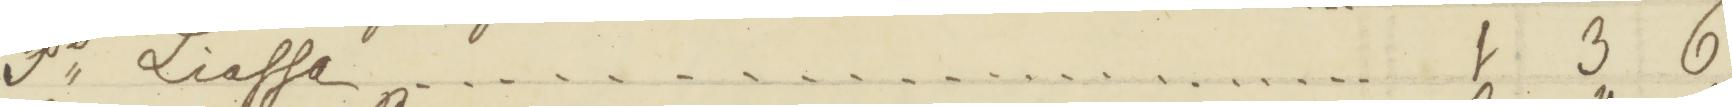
P„s Liassa - - - - - - - - - - - . . . . . . . . . . . 1 3 6
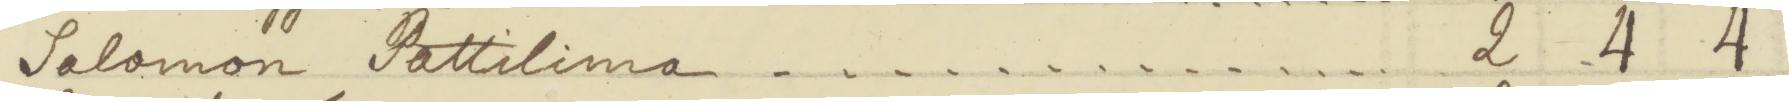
Salomon Pattilima - - - - - - - - - - - - - . 2 4 4
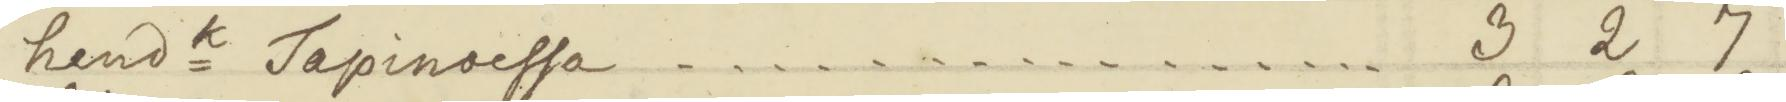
hend=k Tapinoessa . . . . . . . . - - - - - - - - 3 2 7
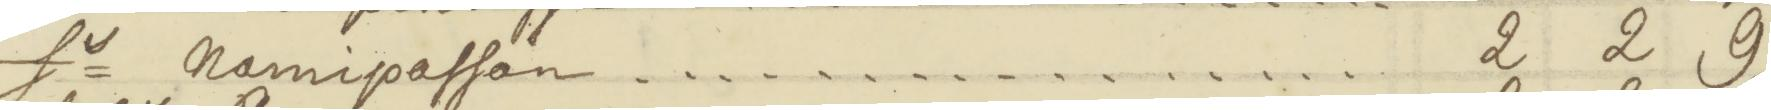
f=s Namipassan . . . . . . . . . . . . . . . 2 2 9
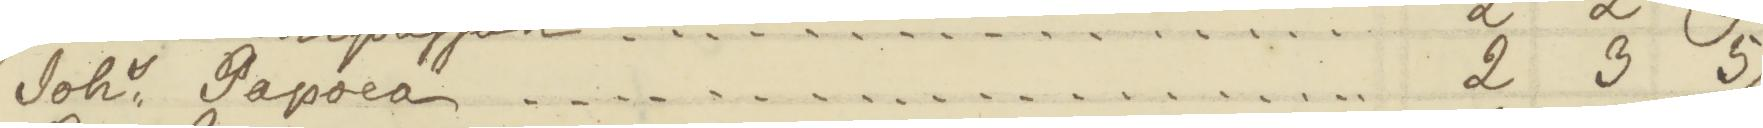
Ioh„s Papoea - - - - - - - - - - - - - - - - - - - - 2 3 5
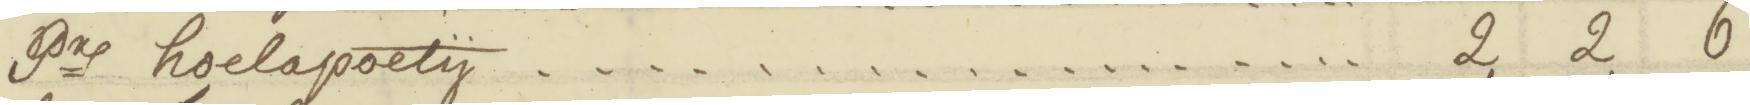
P=r hoelapoetij - - - - . . . . . . . . . . . . . . 2 2 6
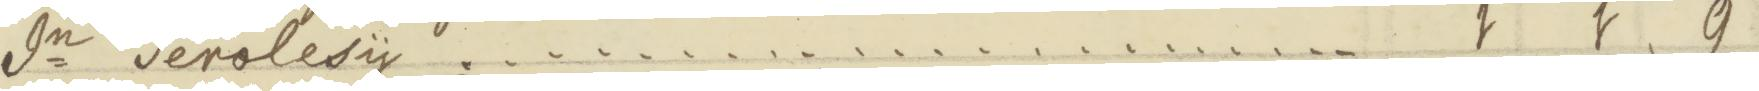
I=n Terolesij . . . . . . . . . . . . . . . . . . . . . . 1 1 9
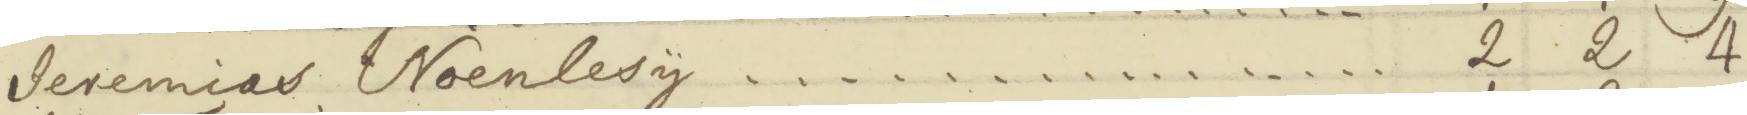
Ieremias Noenlesij . . . . . . . . . . . . . . . . 2 2 4
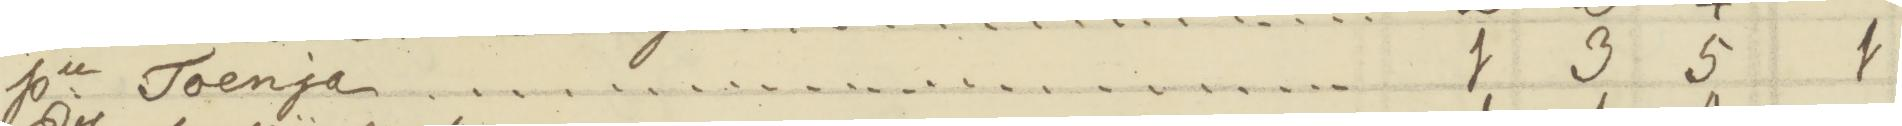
p:r Toenja . . . . . . . . . . . . . . . . . . . . . . . . 1 3 5 1
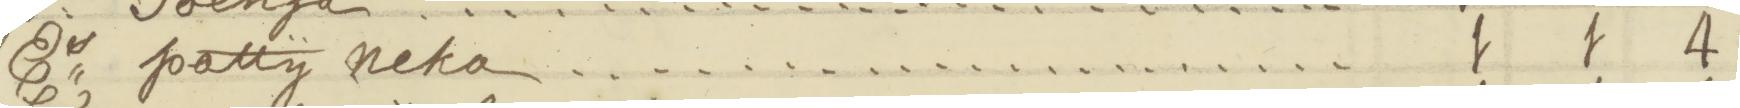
E„s pattij neka . . . . . . . . . . . . . . . . . . . . . 1 1 4
